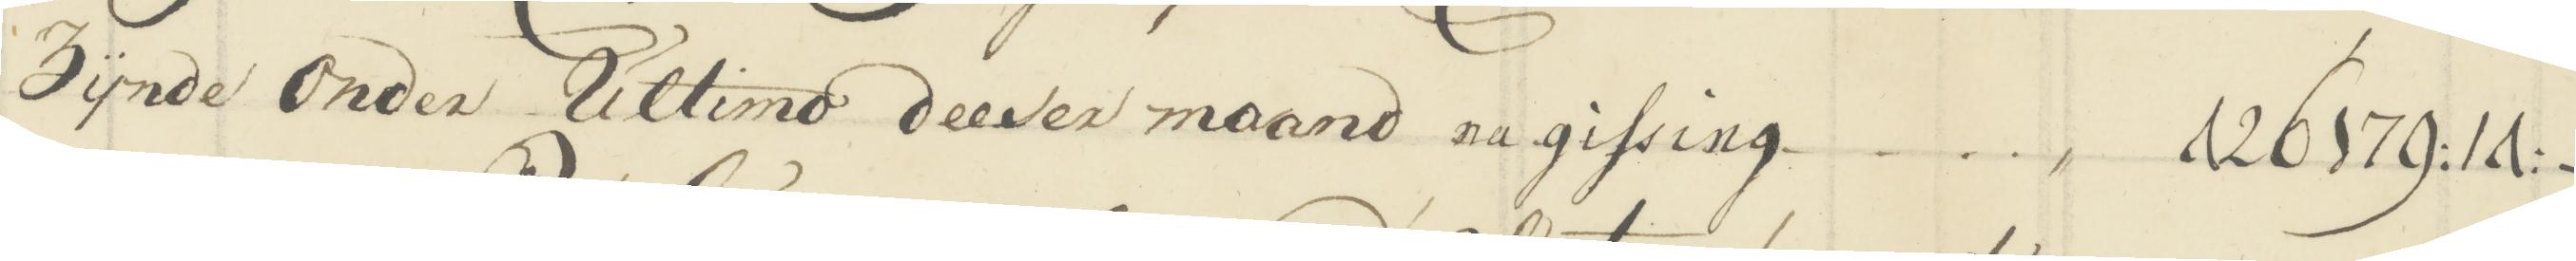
Zijnde onder ultimo deezer maand na gissing. . . . „ 426'179:14:—
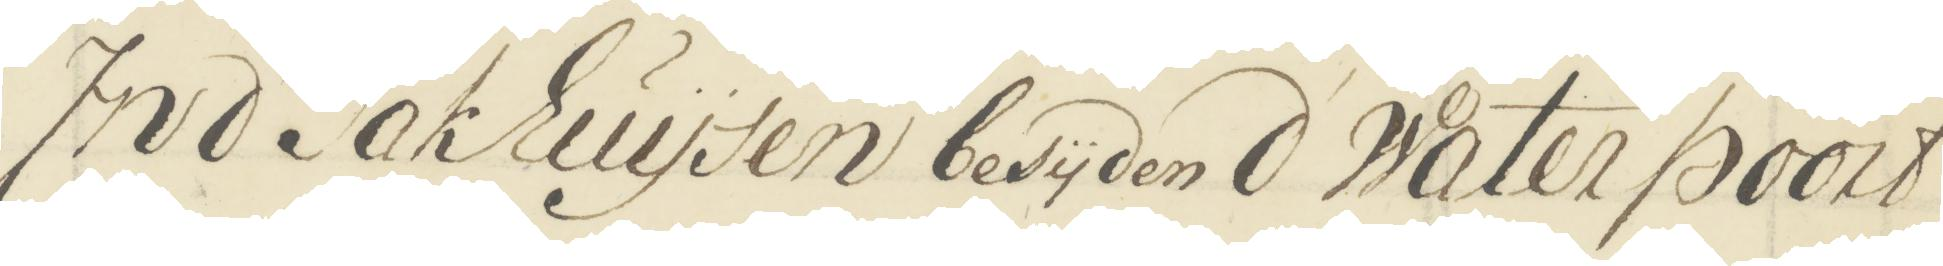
Jn d Pakhuijsen besijden d’ Waterpoort
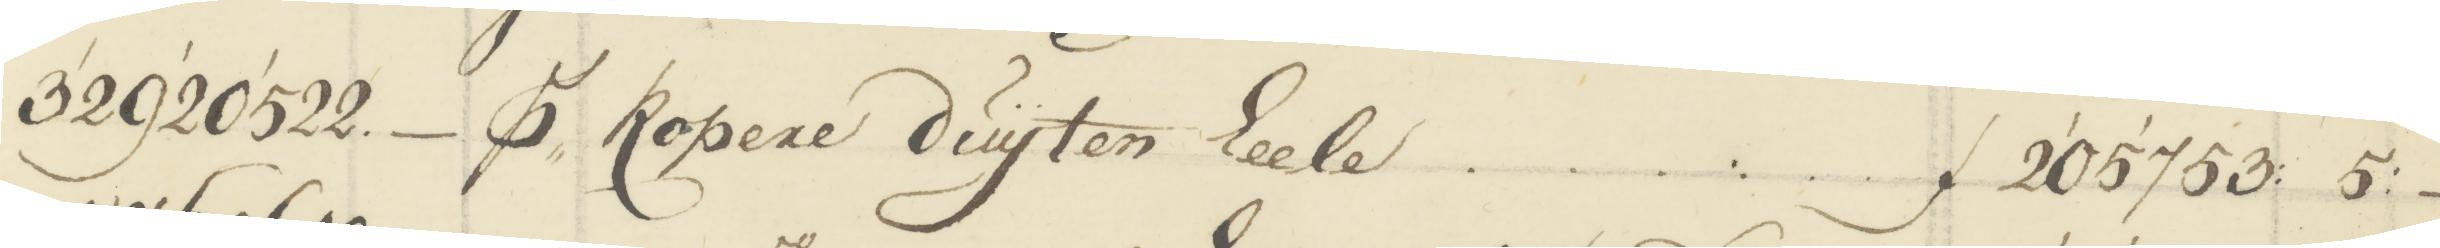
3'29'20'522. — P„ Kopere duijten heele . . . : . . ƒ 2'05'753:5:–
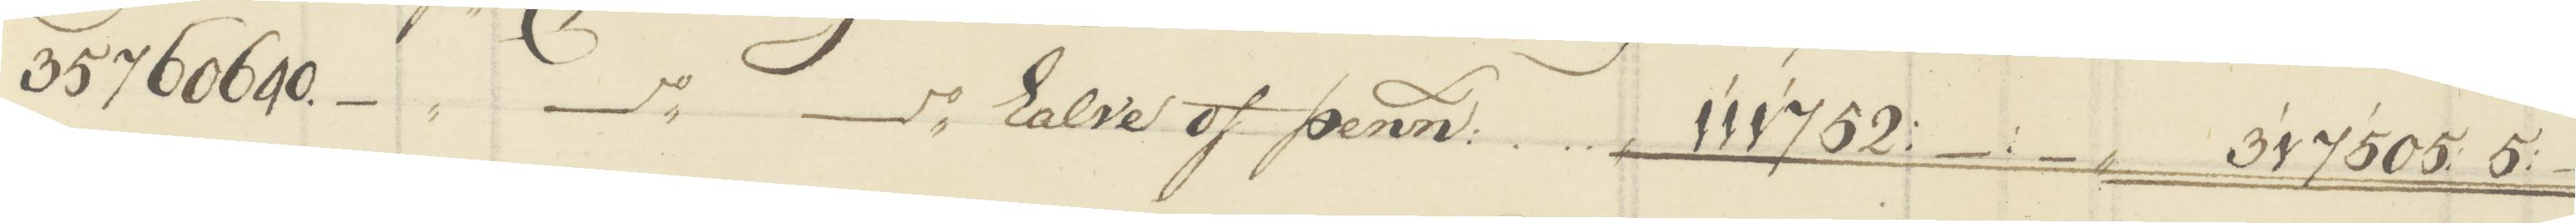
35760640.— „ _„o _„o halve of penn: . .. 1'11'752:—:—„ 3'17'505:5:–
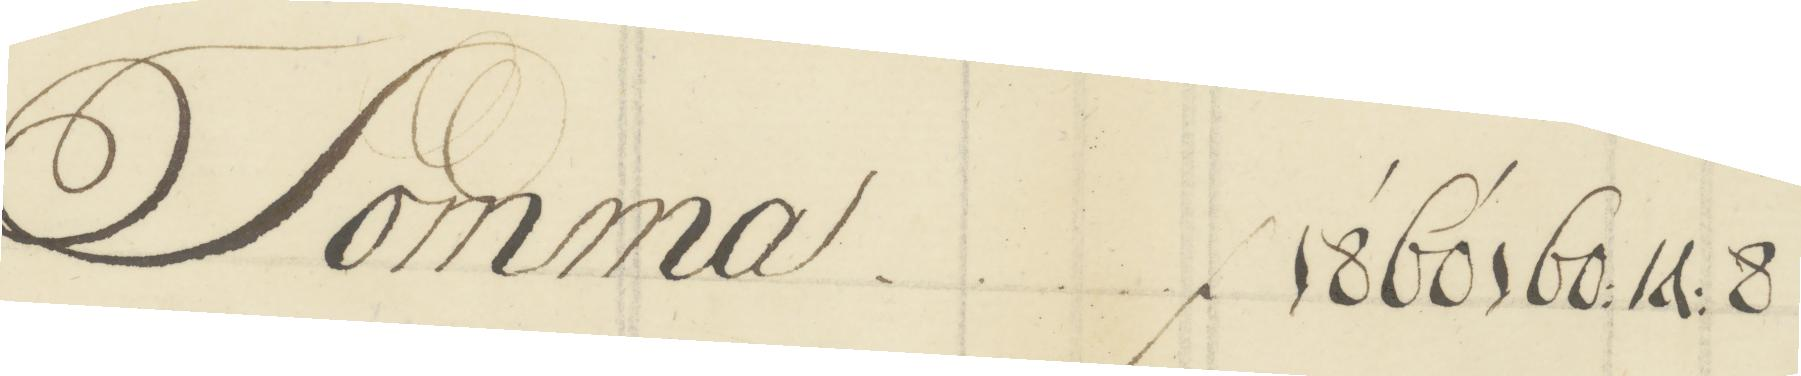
Somma ƒ 18'60'160:14:8
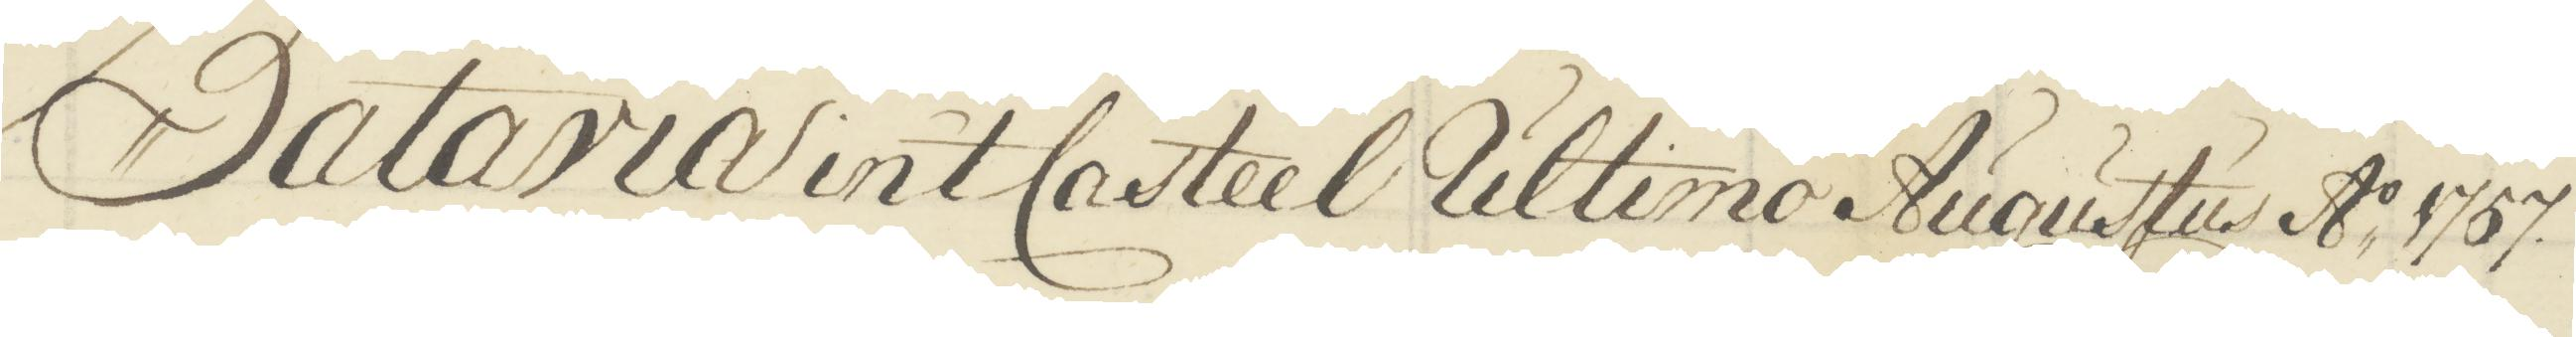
Batavia in’t Casteel Ultimo Augustus A„o 1757.
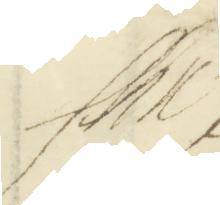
C„hr
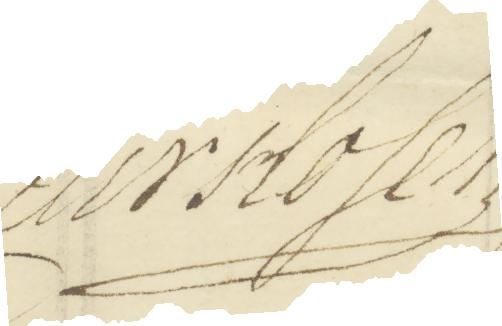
Zurhosen
